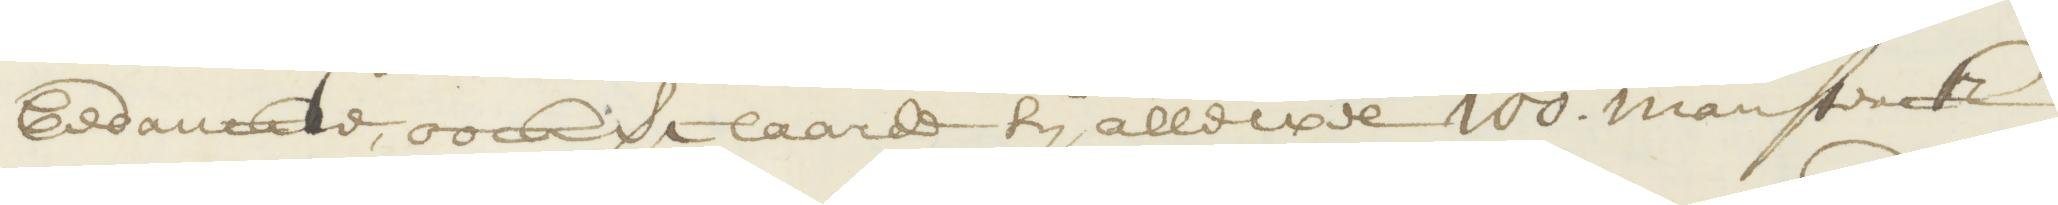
bedanckte, oock verclaarde bij allewel 100. man sterck
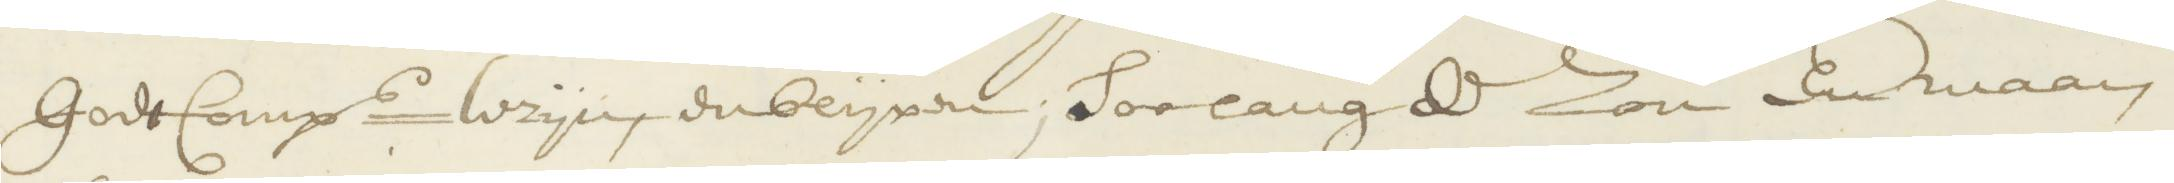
goet Comp=s tezijn, en blijven; soolang de zon En maan
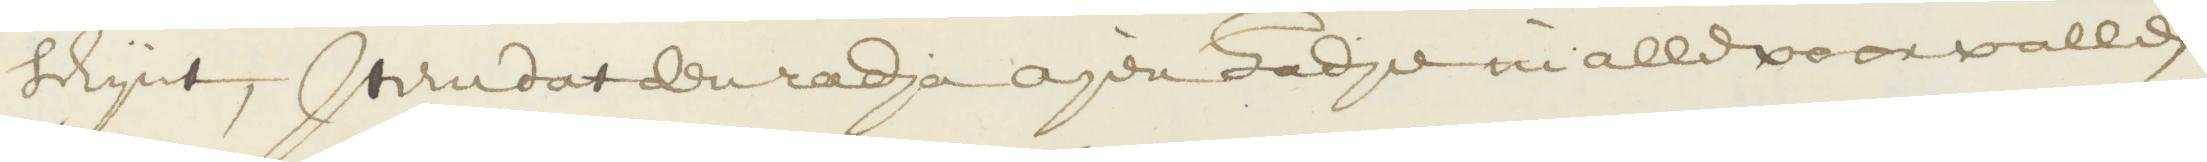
schijnt, Jtem dat den radja ajer hadje in alle voorvallen
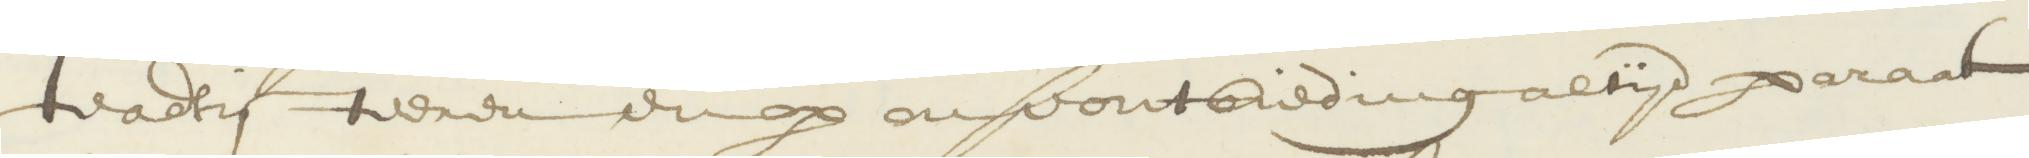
teadsisteeren en op onse ontbieding altijd paraat
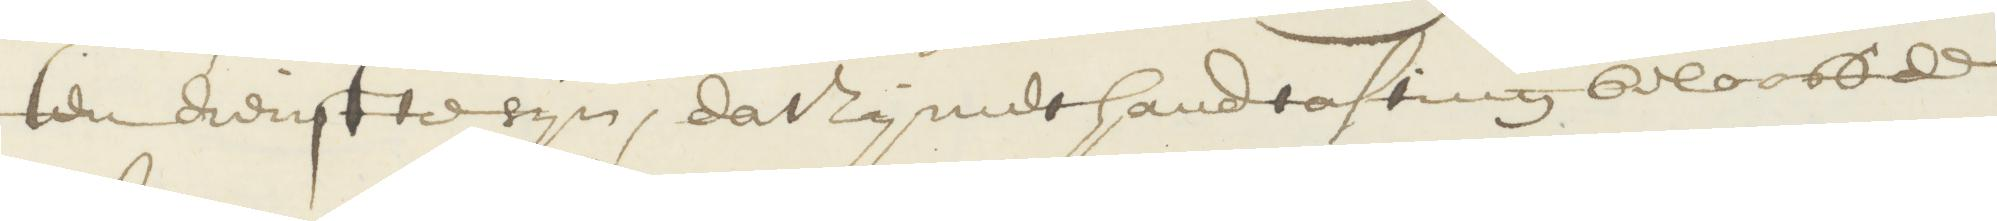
ten dienst te sijn, dat zij met handtasting belooffde
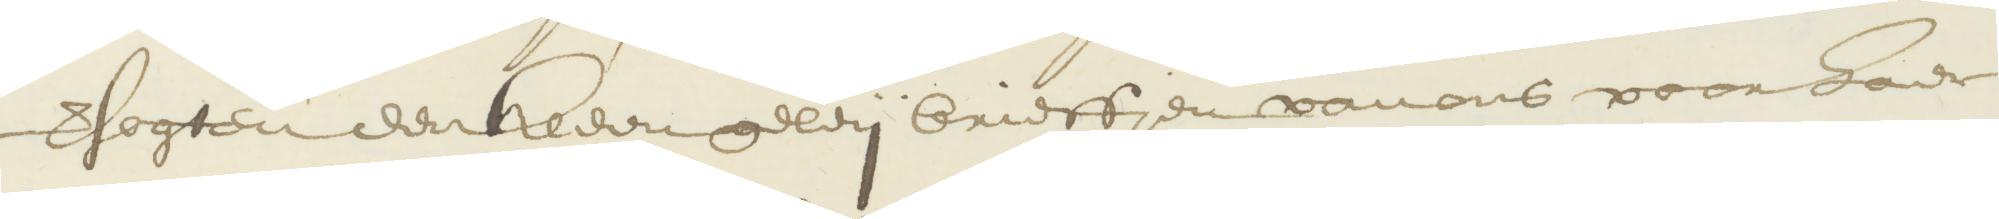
versogten een kleen geleij brieffjen van ons voor haer
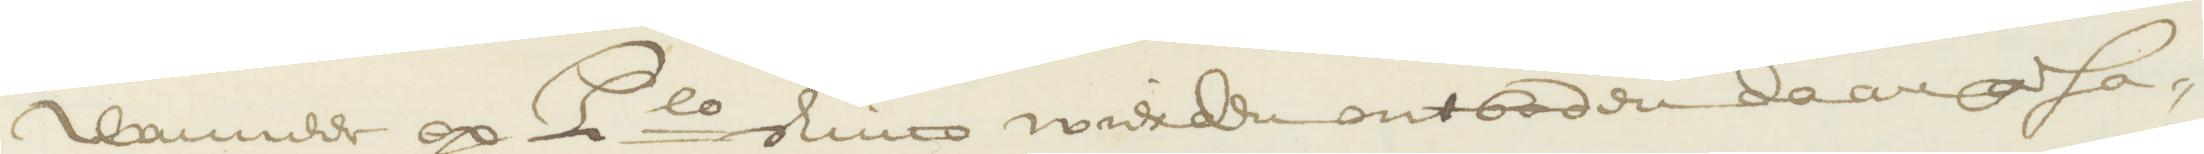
wanneer op P=lo chinco wierden ontboden daar gesa„
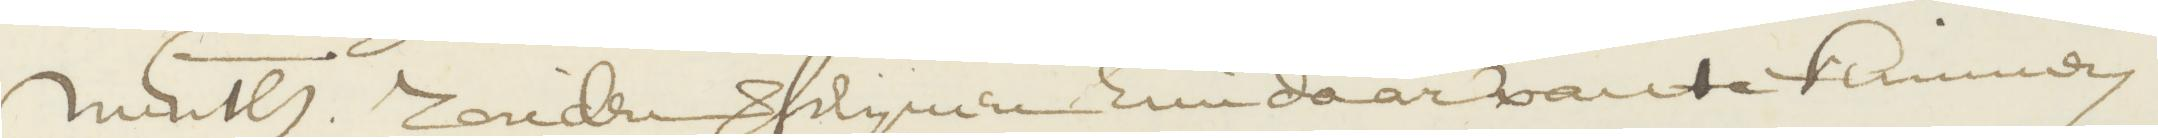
mentlijk zouden verschijnen hun daar van te kunnen
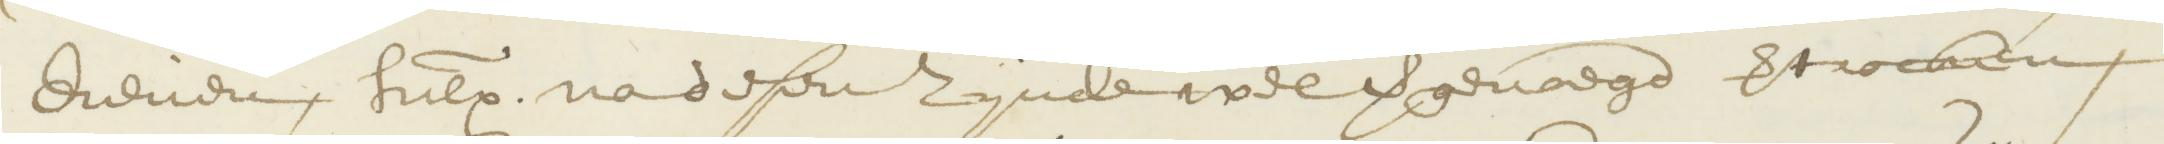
dienen, sulx na desen zijnde welvergenoegd vertrocken,
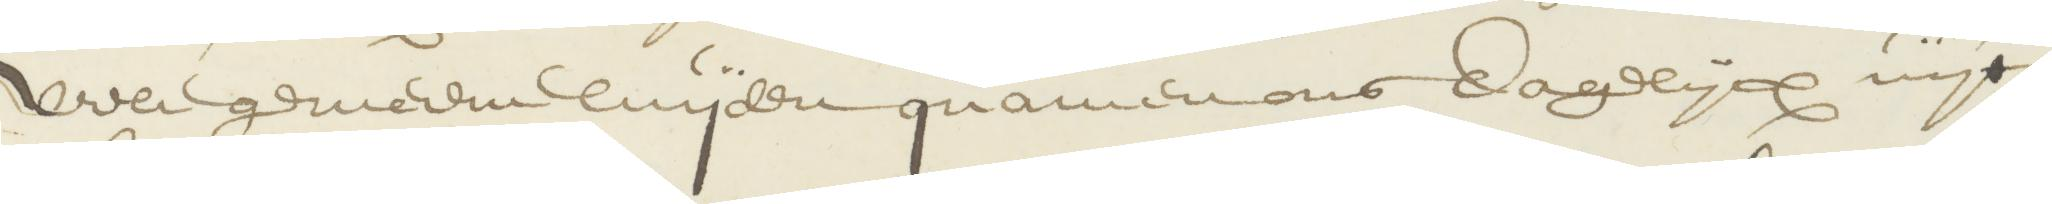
veele gemeene luijden quamen ons dagelijcx uijt
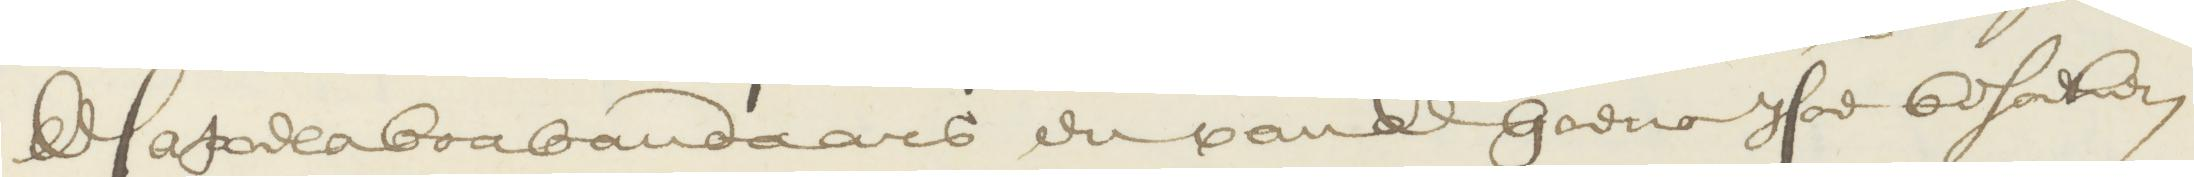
de sapoelaboabandaars en vande Goeno Jsoe besoeken
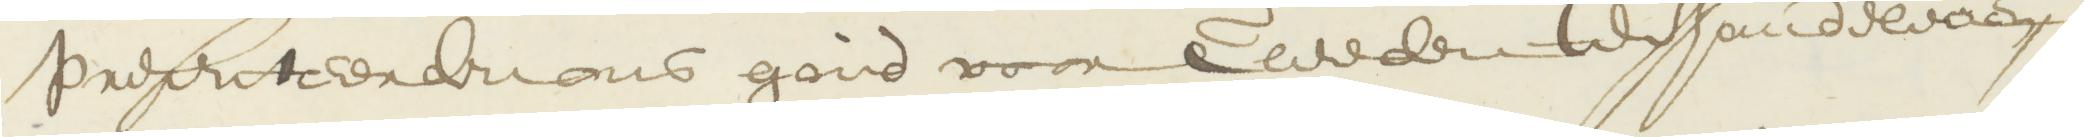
presenteerden ons goud voor Cleeden te verhandeleden,
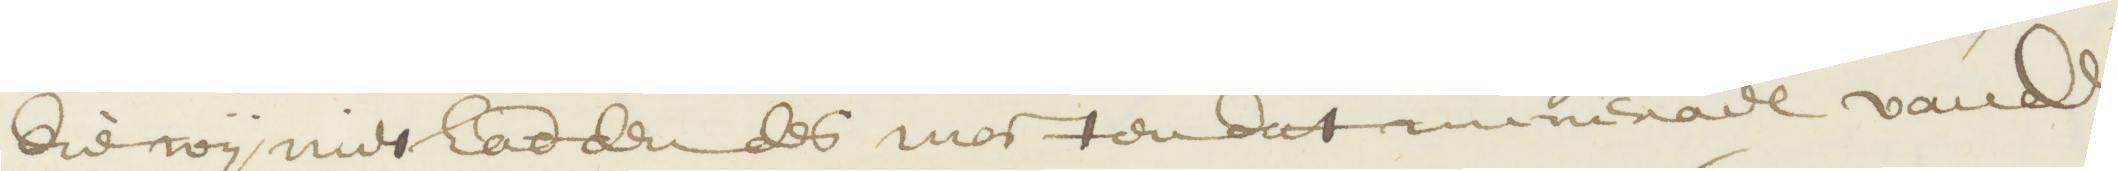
die wij niet hadden des mosten dat minerael vande
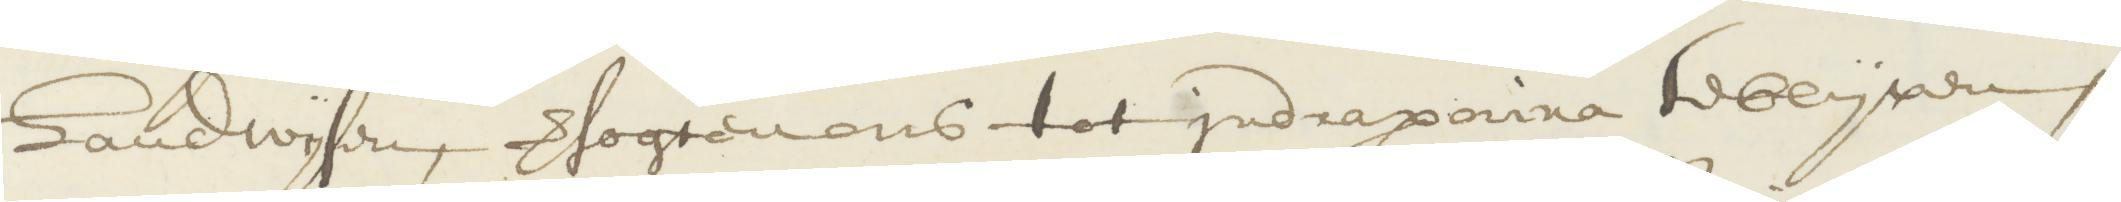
handwijsen, versogten ons tot jndrapoura te blijven,
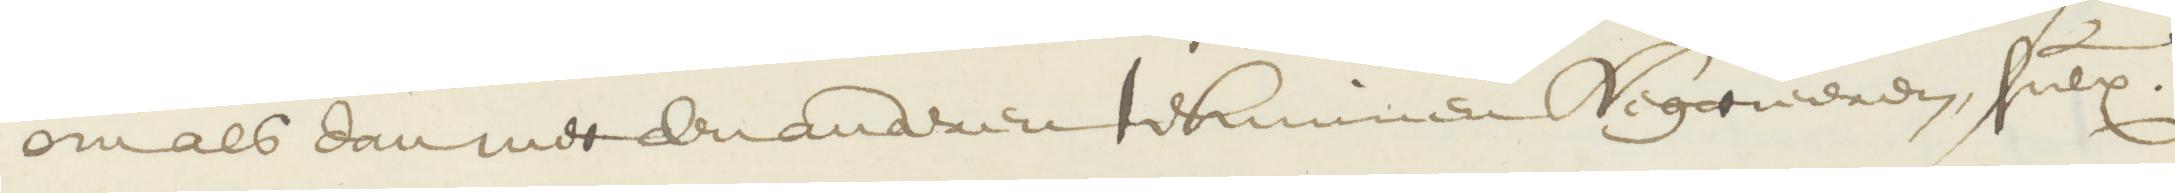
om als dan met den anderen te kunnen Negotieeren, sulx
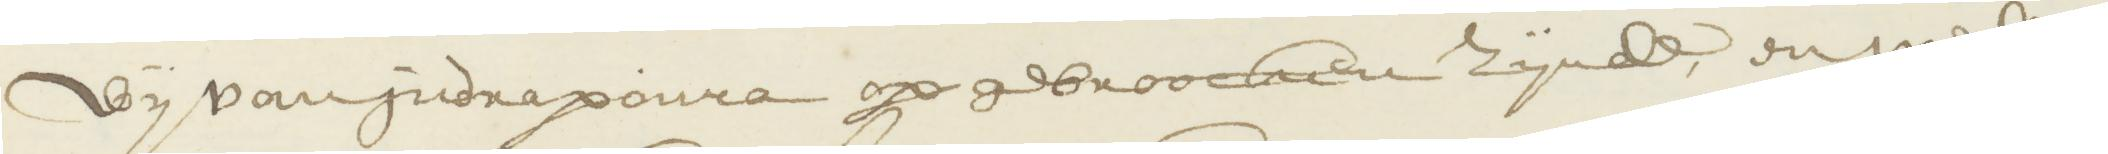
wij van jndrapoura op gebroocken zijnde, en weder
